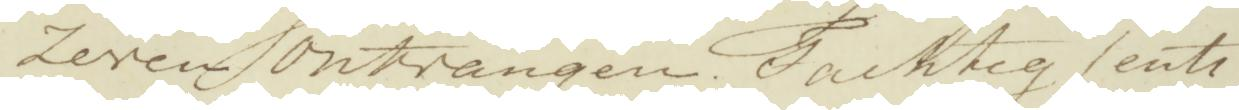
zeven ontvangen. Tachtig Cents
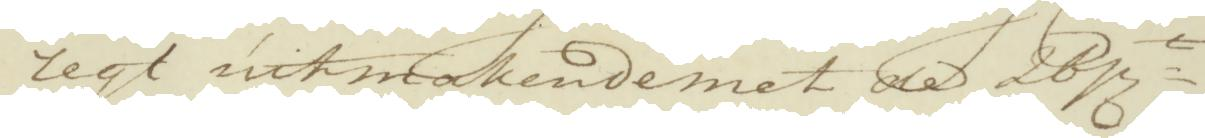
regt uitmakende met de 26/c=t
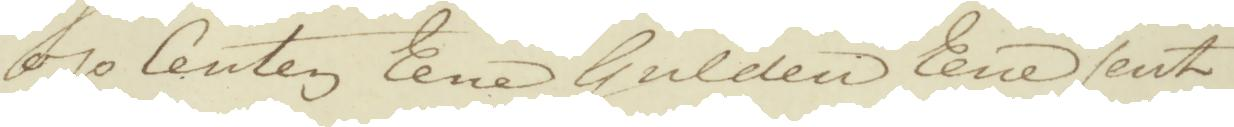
op Centen Eene Gulden Eene Cent
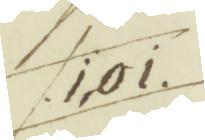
ƒ 1,01.
